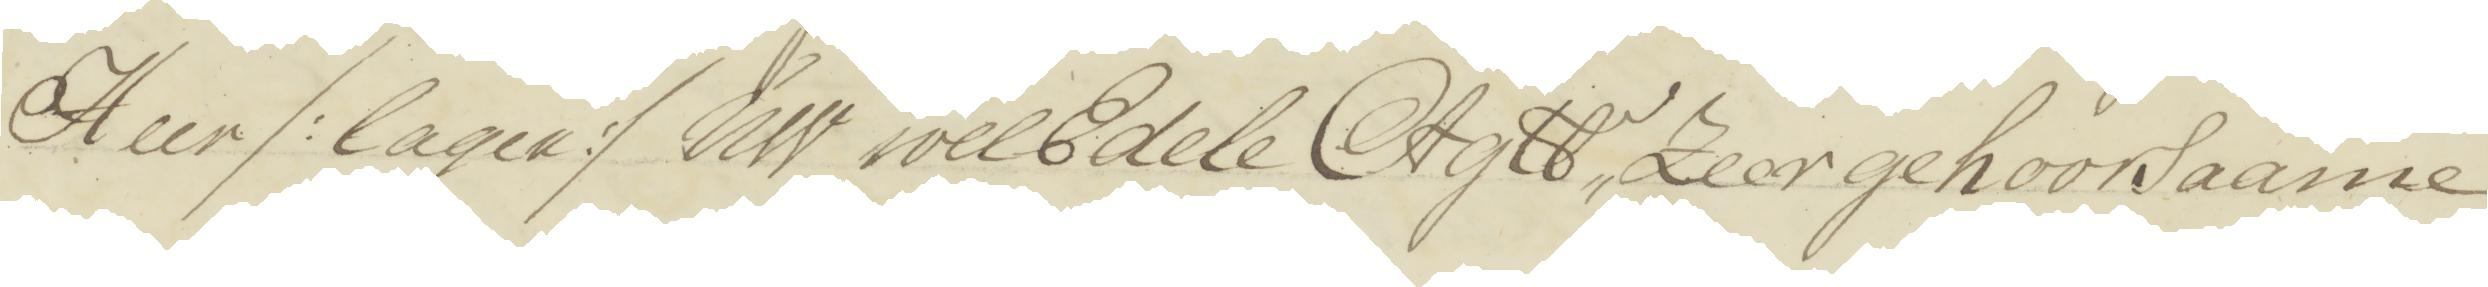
Heer /:lager:/ Uw wel Edele Agtb„e zeer gehoorsaame
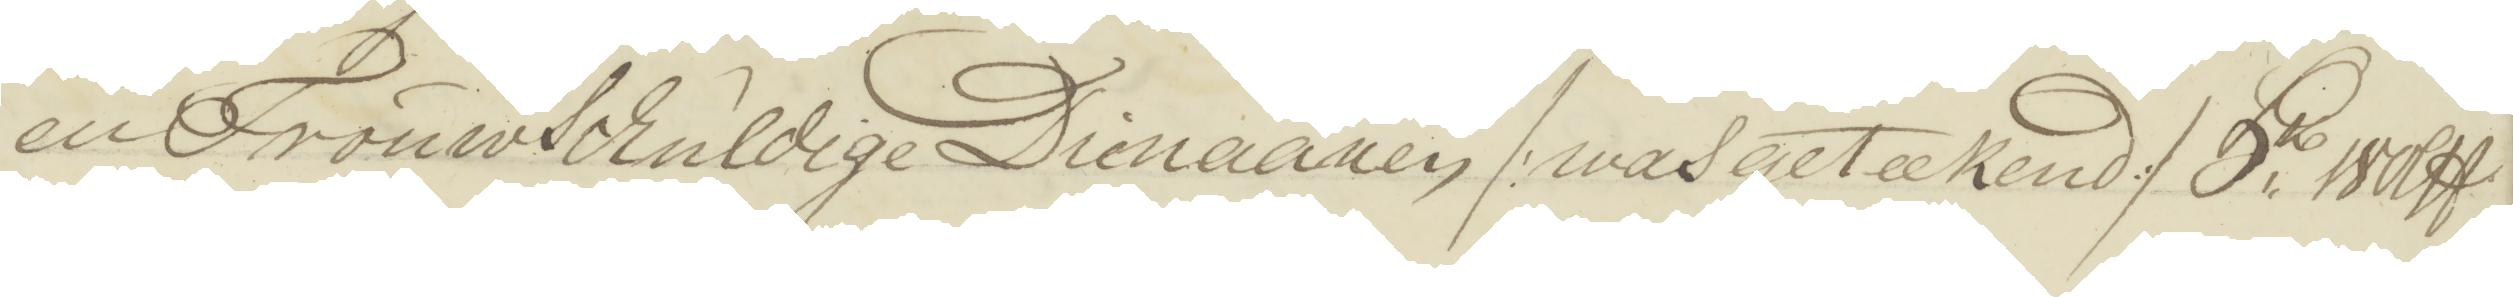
en Trouwschuldige Dienaaren /:was geteekend:/ H„k wolff
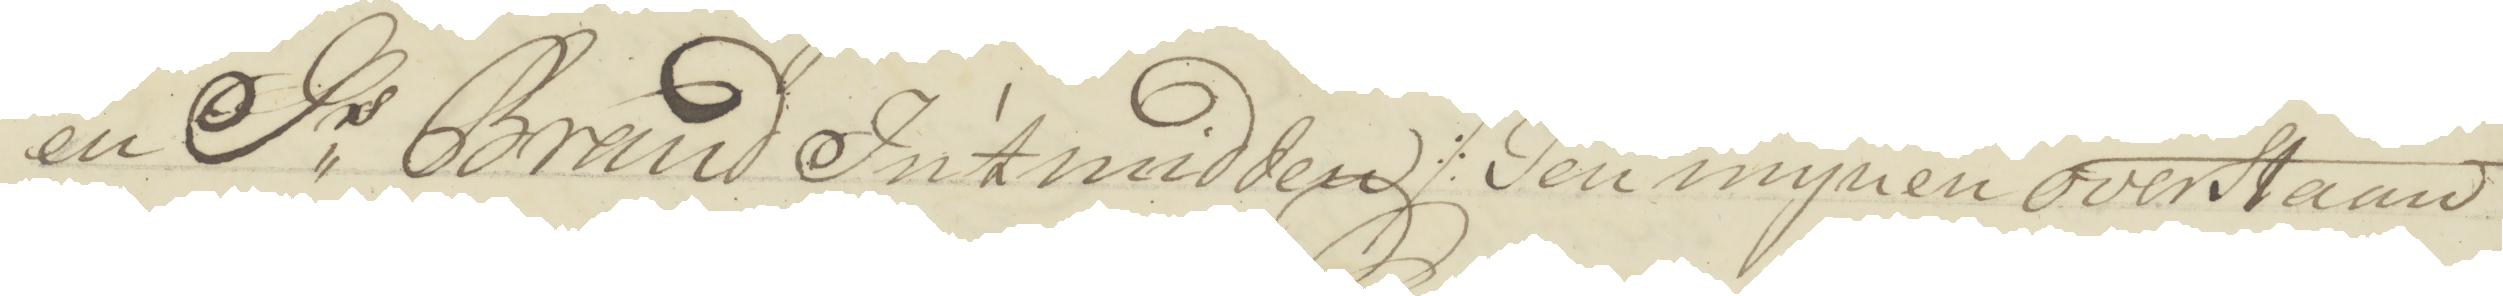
en I:s Brand In 't midden /:Ten mijnen overstaan
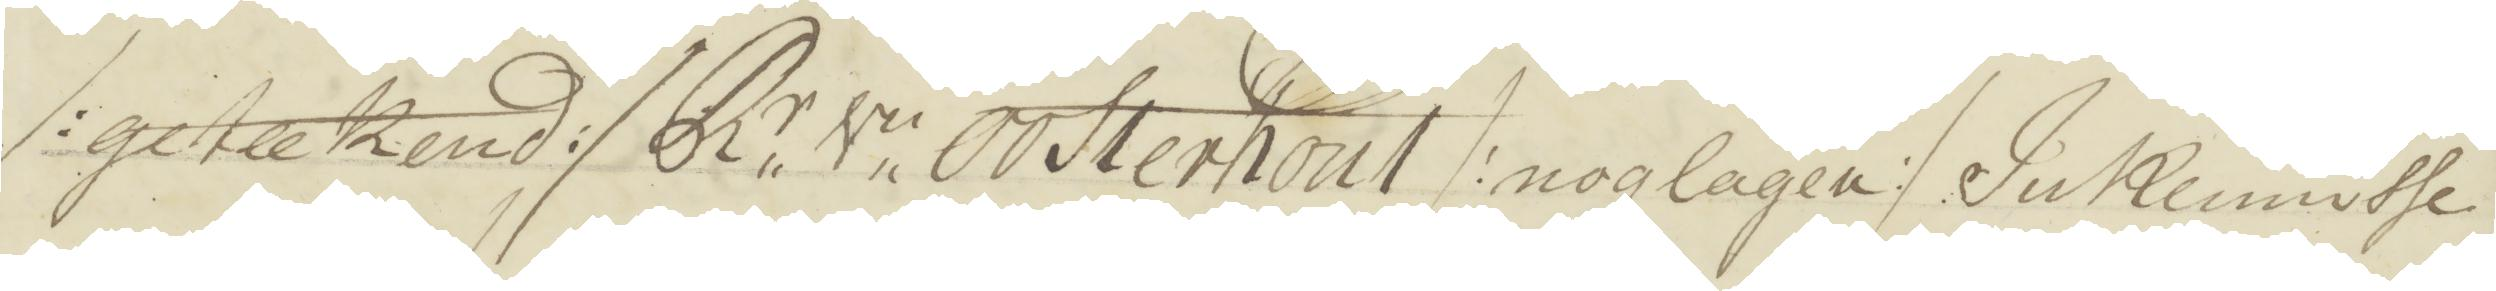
/:geteekend:/ R„r v„n Oosterhout /:nog lager:/ In kennisse
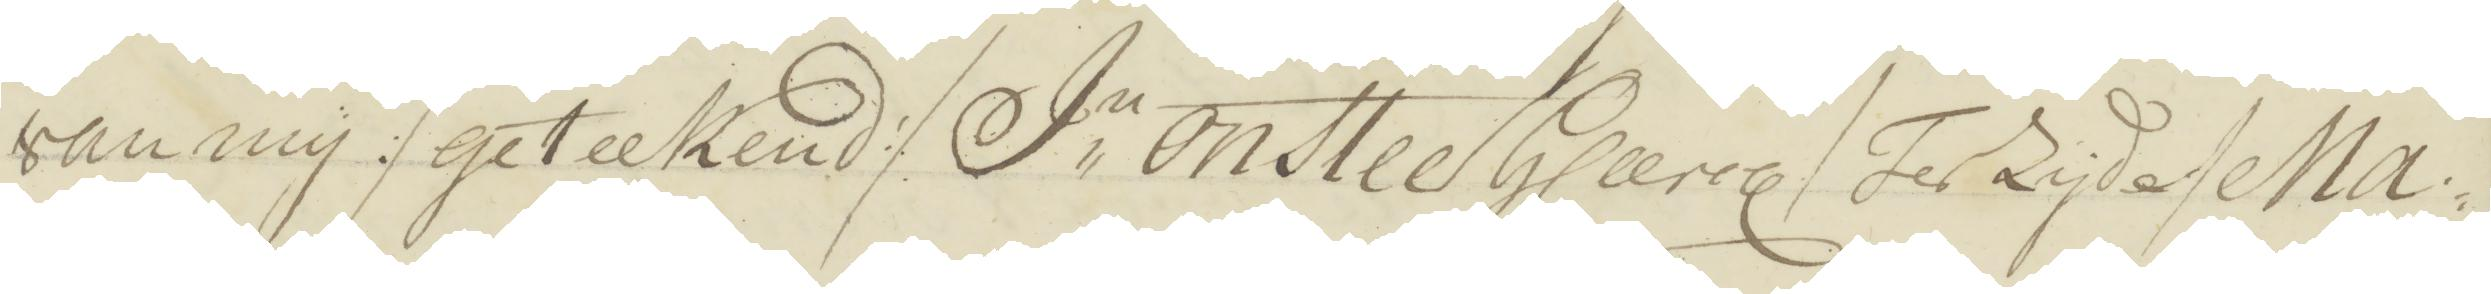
van mij :/geteekend /: I„n onstee / GClercq / Ter zijde / Ma.„
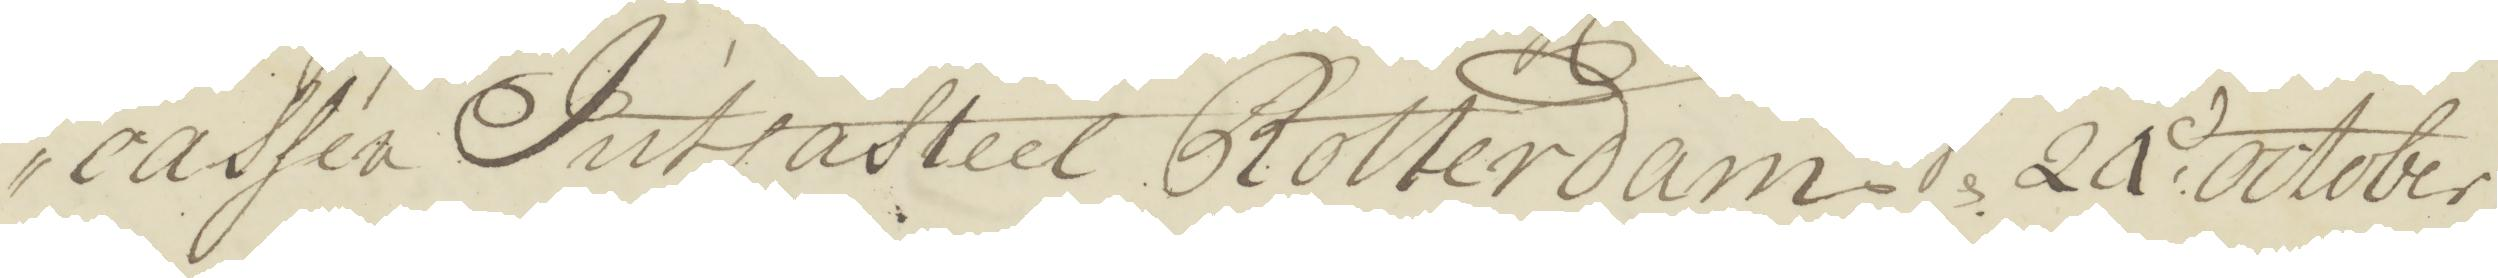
„casser In't Casteel Rotterdam den 24:e october
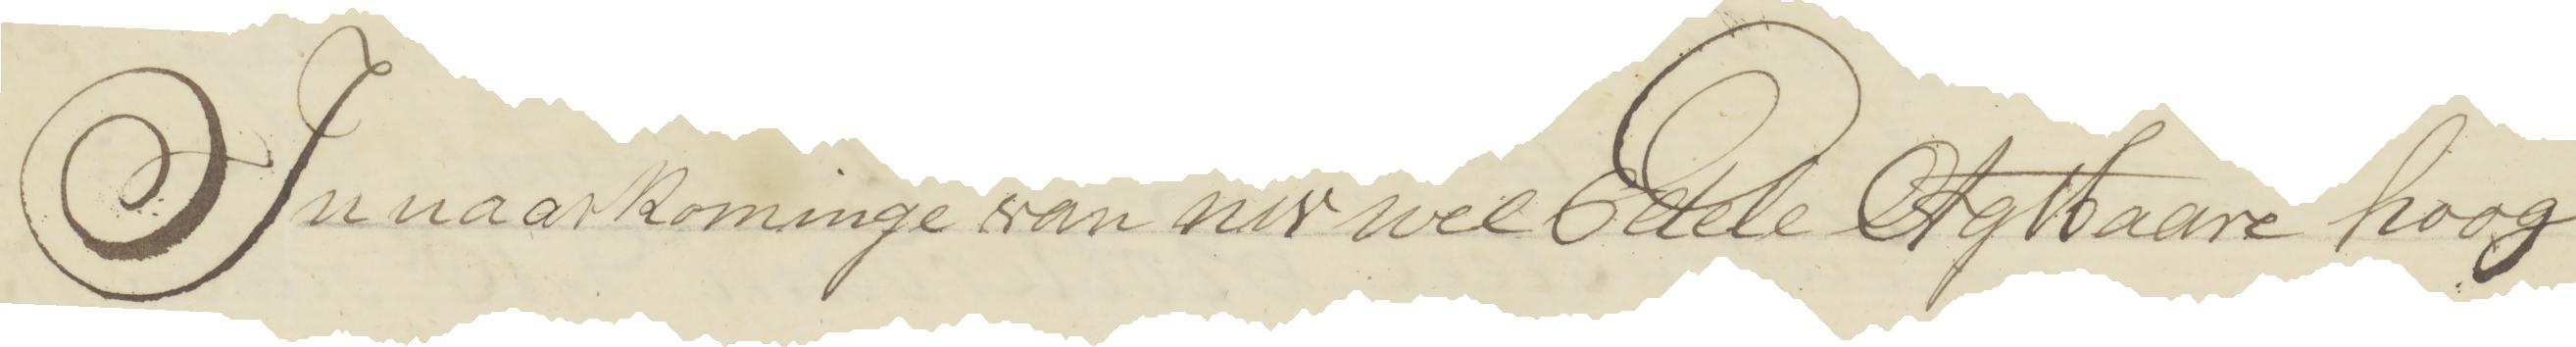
In naarkominge van uw wel Edele Agtbaare hoog
